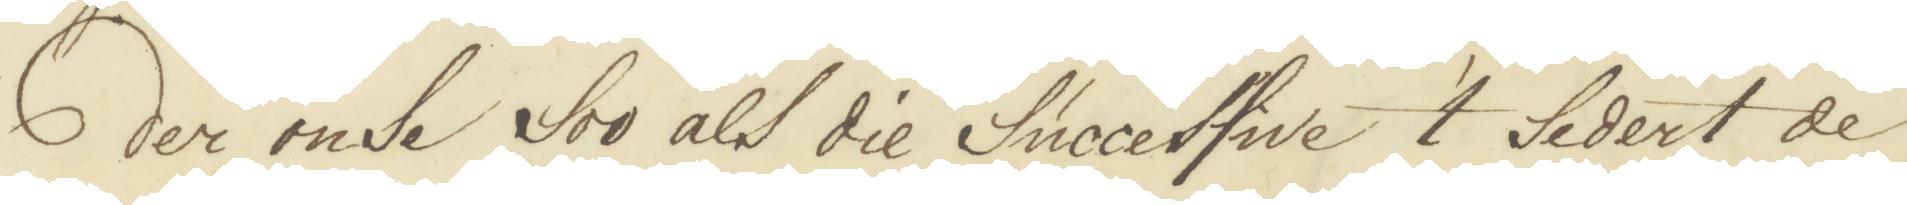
der onse soo als die successive ’t sedert de
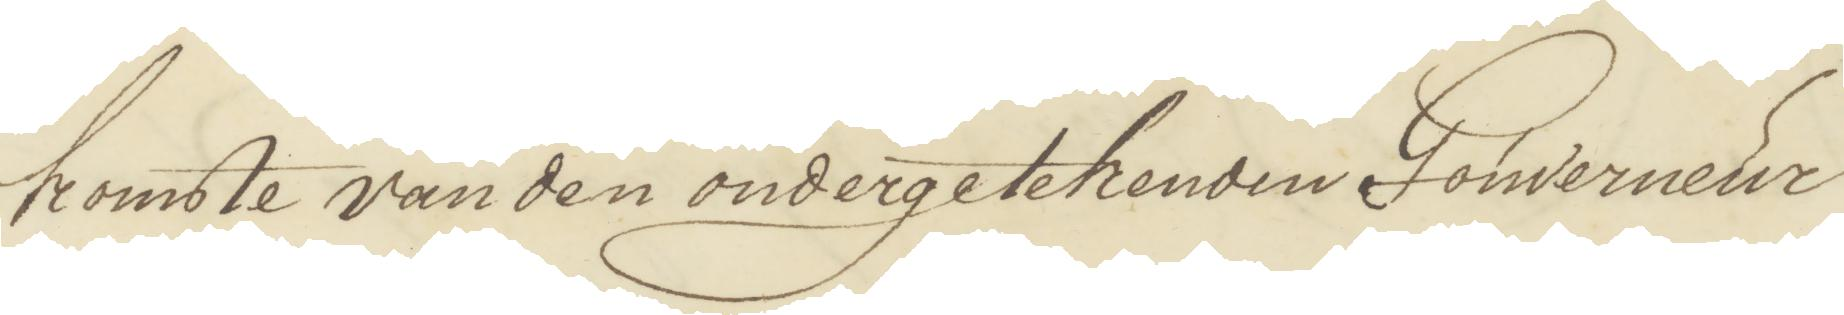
komste van den ondergetekenden Gouverneur
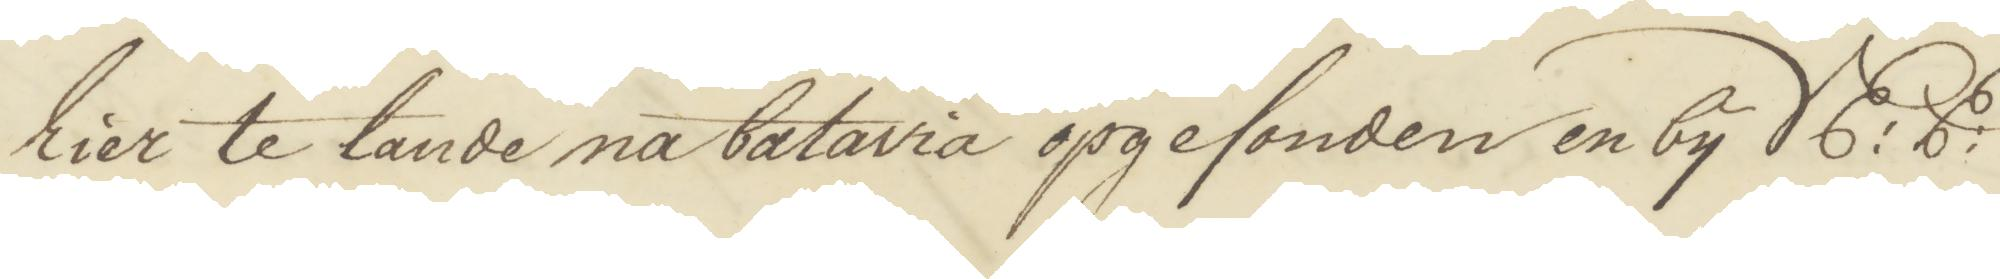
hier te lande na batavia opgesonden en bij VE: E:
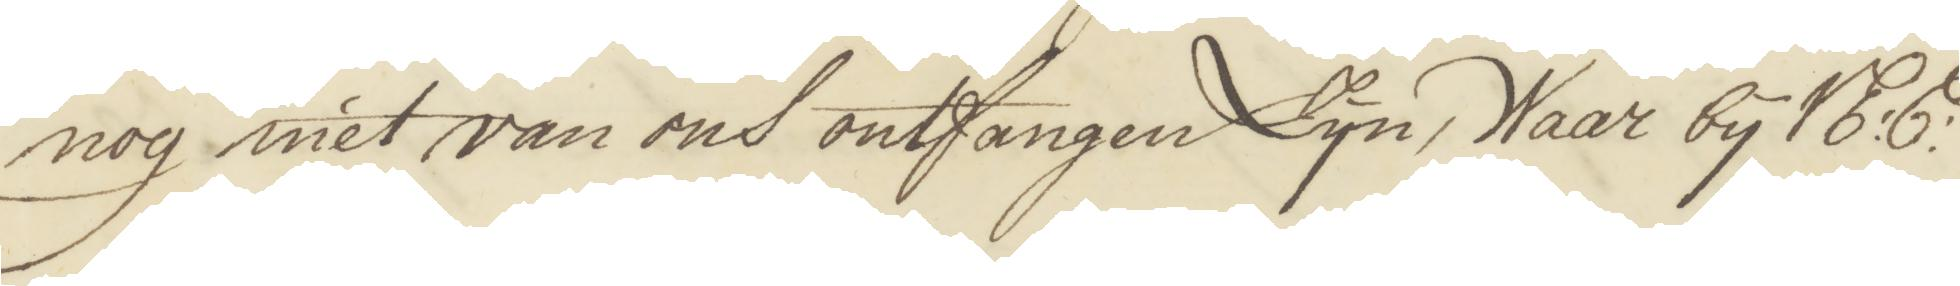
nog niet van ons ontfangen zijn, Waar bij VE: E:
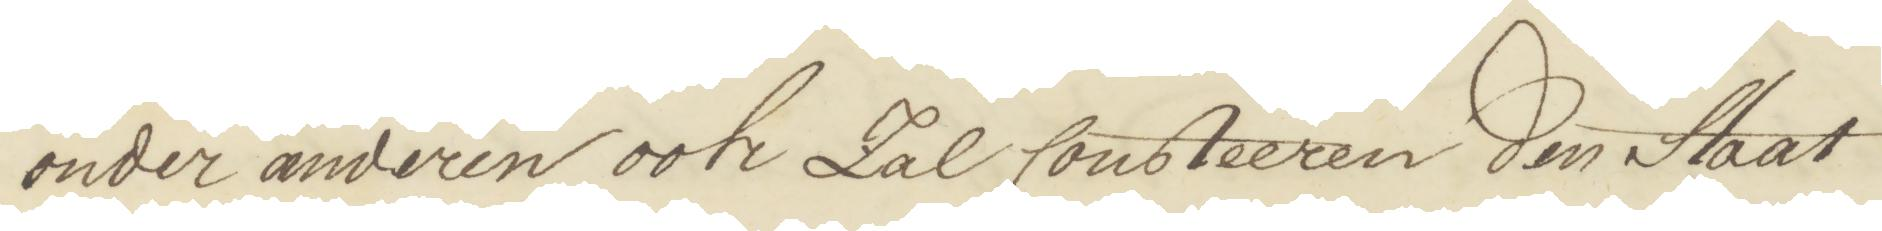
onder anderen ook zal Consteeren den staat
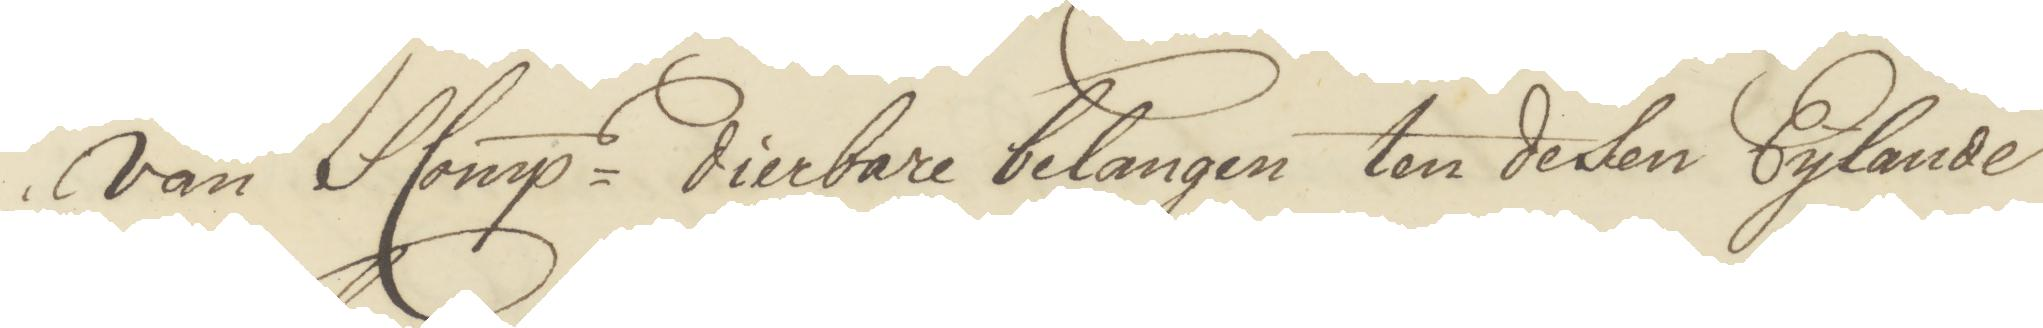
van ’s Comp=s dierbare belangen ten desen Eijlande
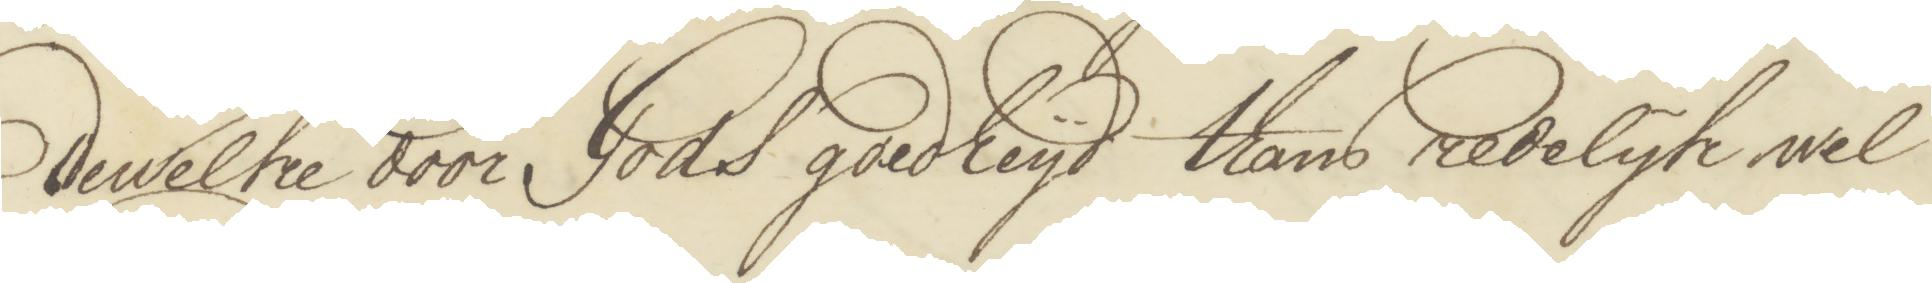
dewelke door Gods goedheijd thans redelijk wel
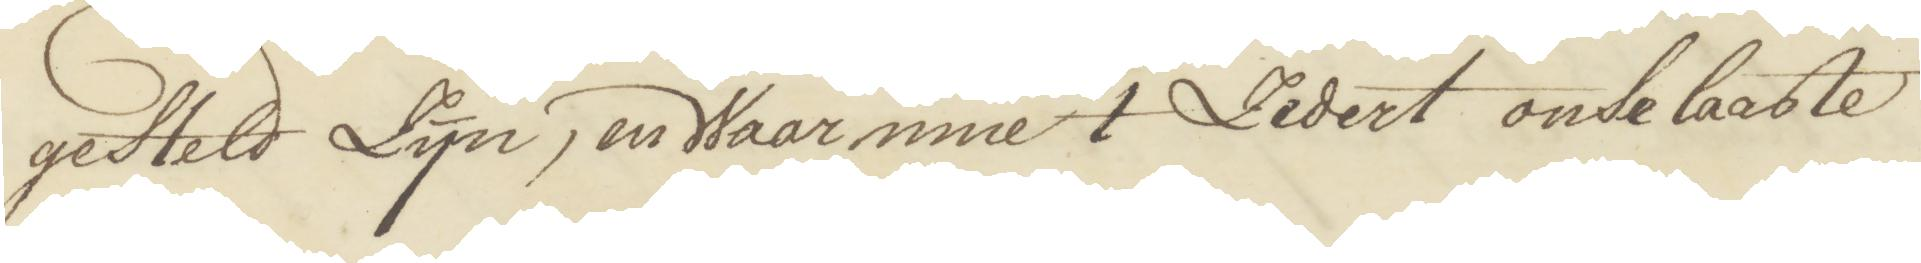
gesteld zijn, en Waar inne 't zedert onse laaste
